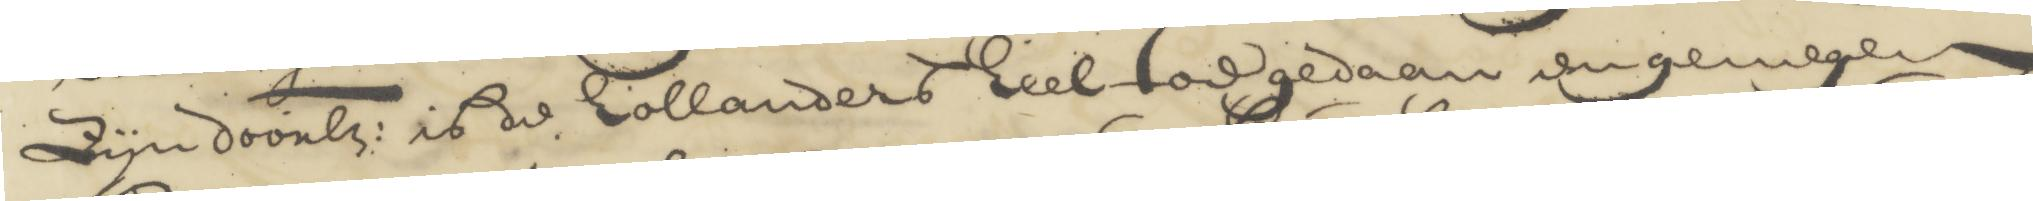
zijn doorlijk is de hollanders heel toe gedaan en genegen;
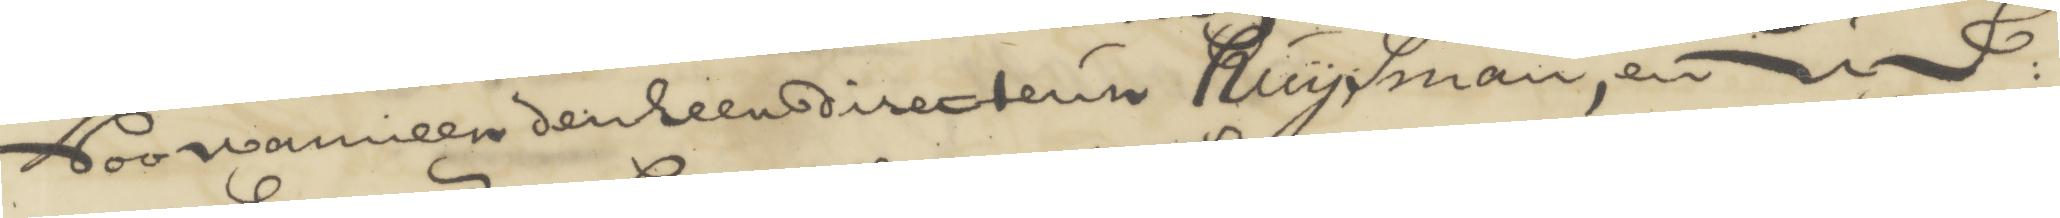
soo wanneer den heere directeur Huijsman, en uE:
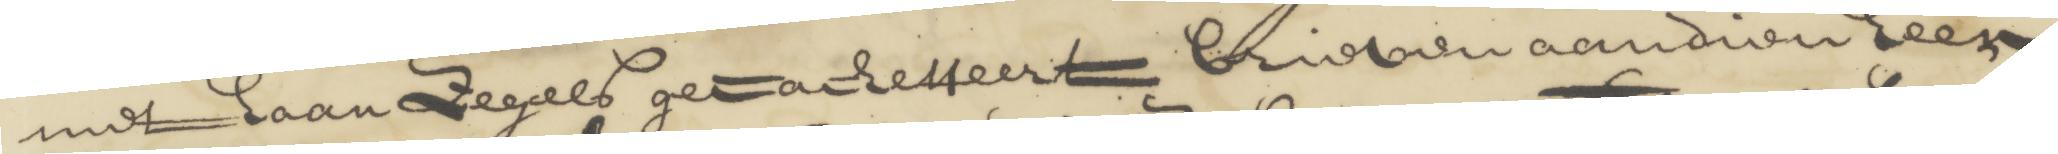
met haar zegels gecachetteert brieven aandien heer
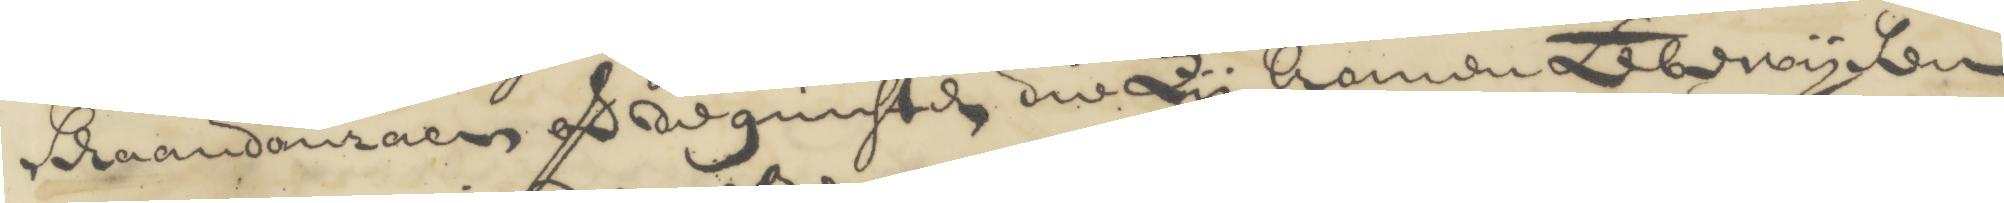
schaandauraen over de gunsten die zij komen te bewijsen
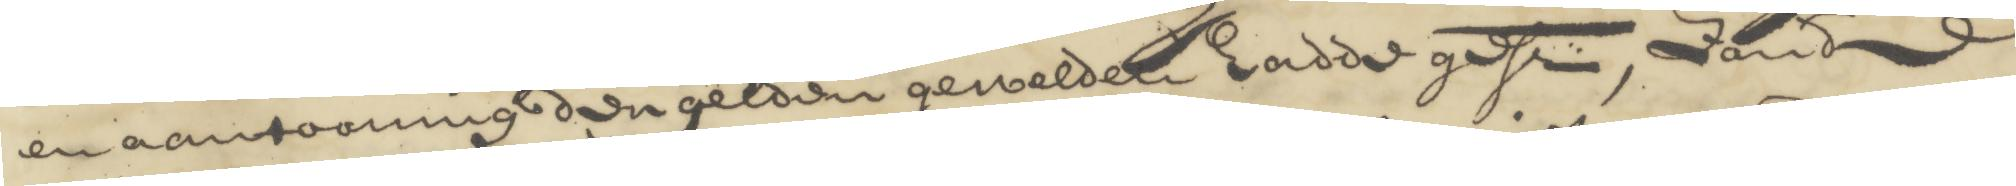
en aantooning den gelden gewelden hadde gesz:, zoude
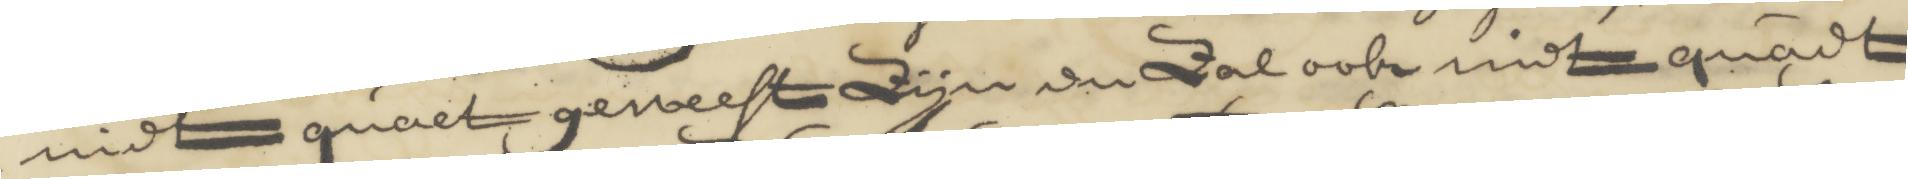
niet quaet geweest zijn en zal ook niet quaet
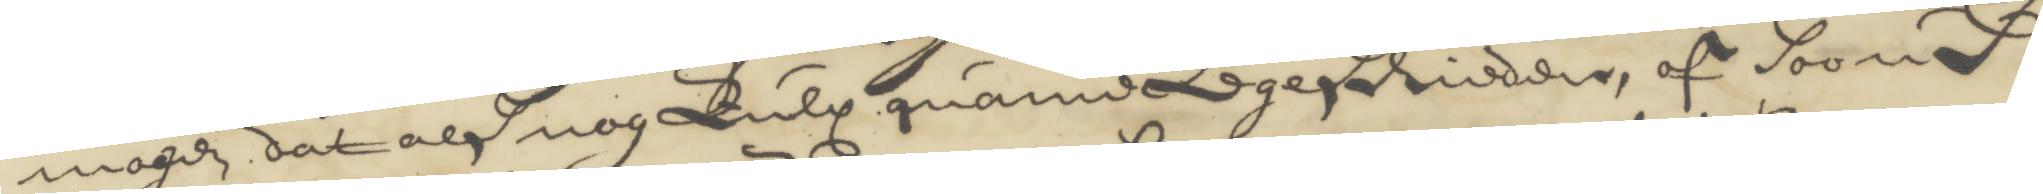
mogen dat als nog zulx quame te geschieden, of soo uE:
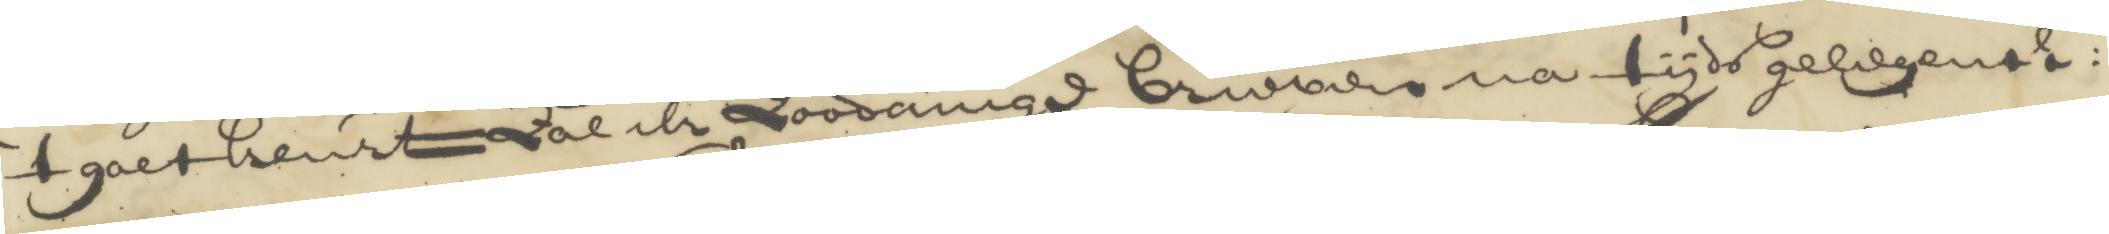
’t goetkeurt zal ik zoodanige brieven na tijds gelegenth:t
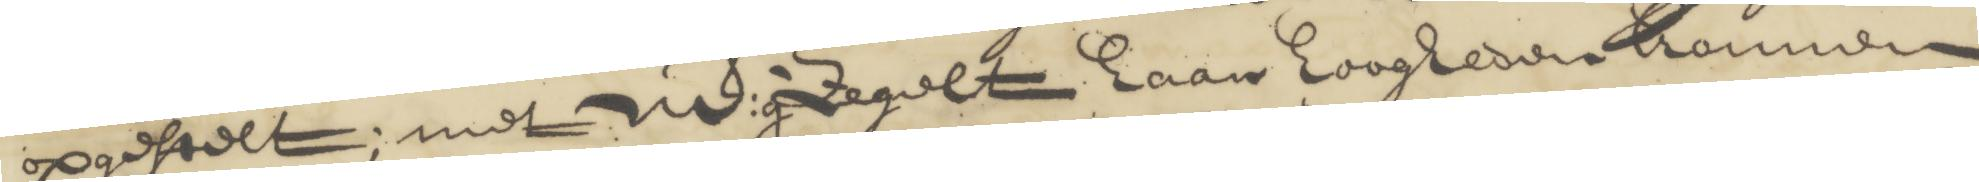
opgestelt; met uE: g'zegelt haar hoogheden konnen
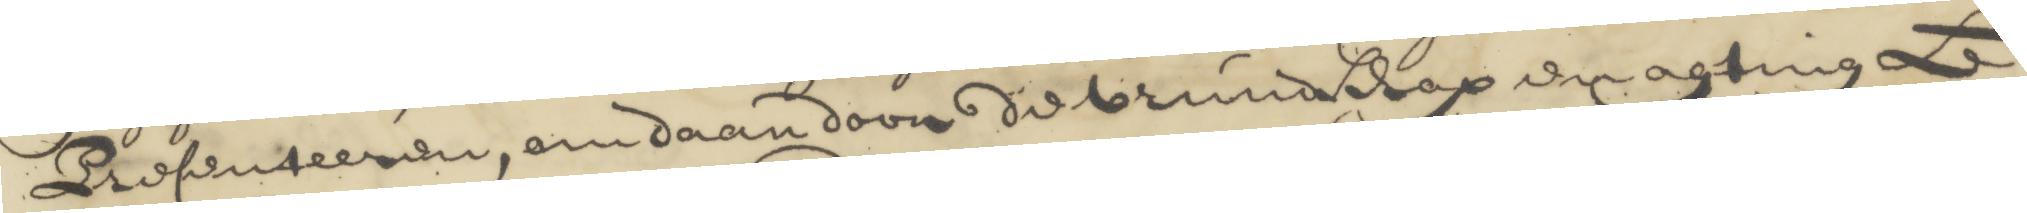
presenteeren, om daar door de vrundschap en agting te
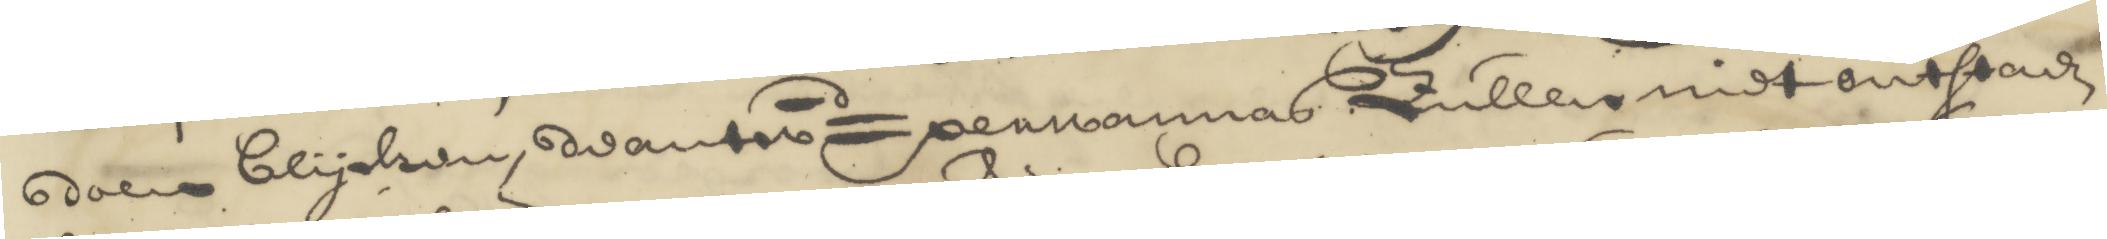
doen blijcken, de antw=d perwannas zullen niet ontstaen
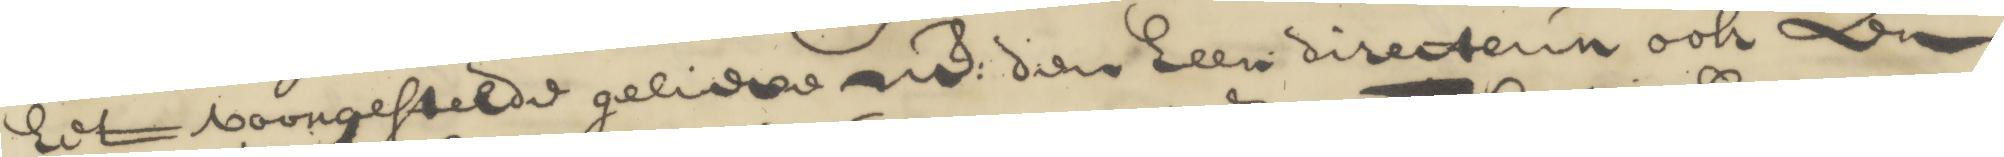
het voorgestelde gelieve uE: den heer directeur ook ten
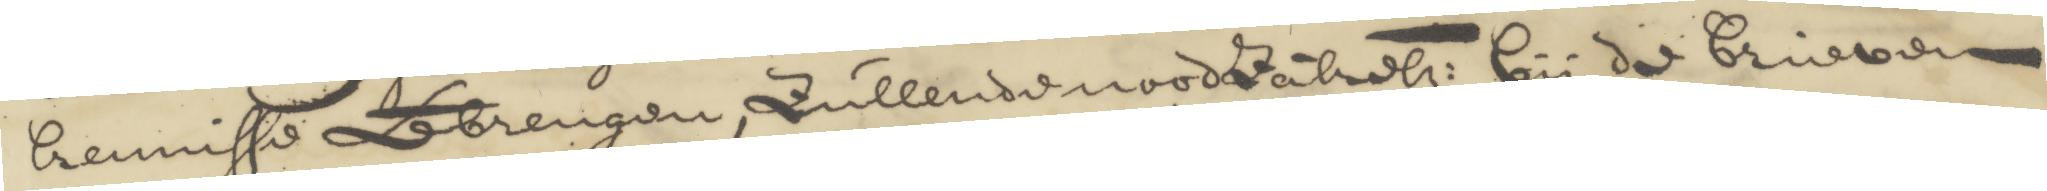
kennisse tebrengen, zullende noodsakelijk bij de brieven
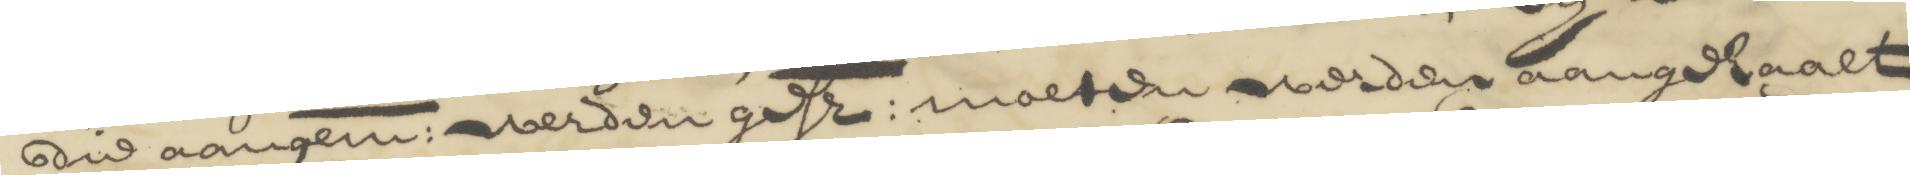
die aangem: werden gesz: moeten werden aangehaalt
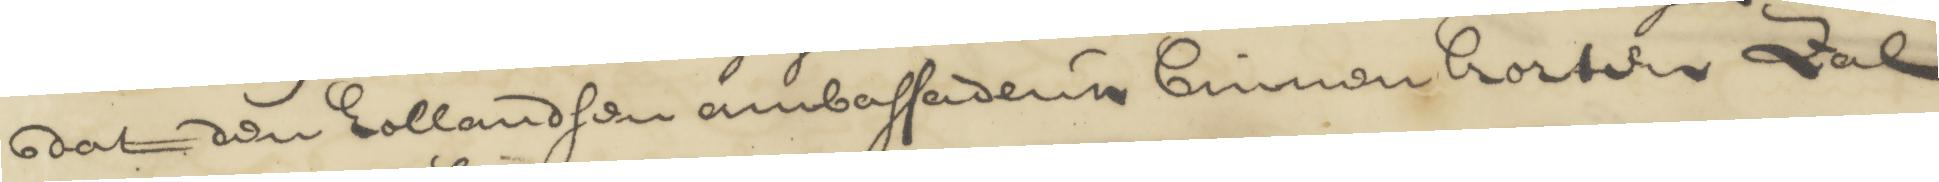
dat den hollandsen ambassadeur binnen korten zal
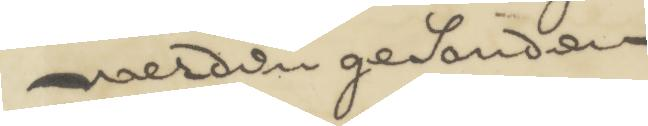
werden gesonden.
